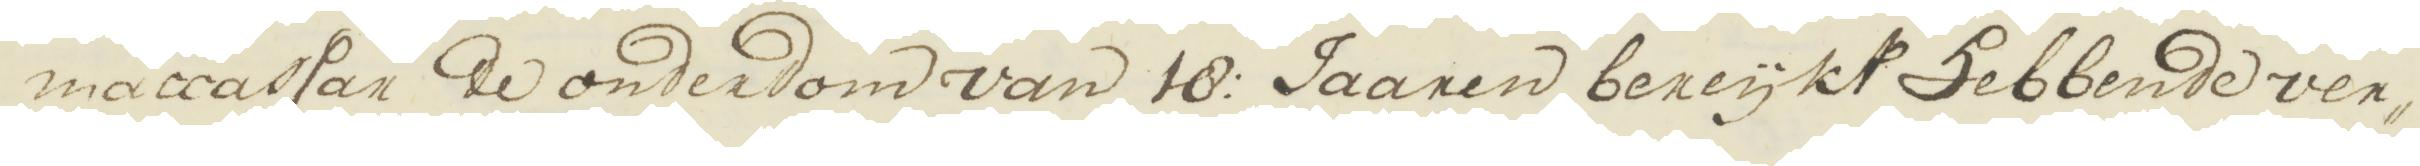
maccassar de ouderdom van 18: Iaaren bereijkt hebbende ver„
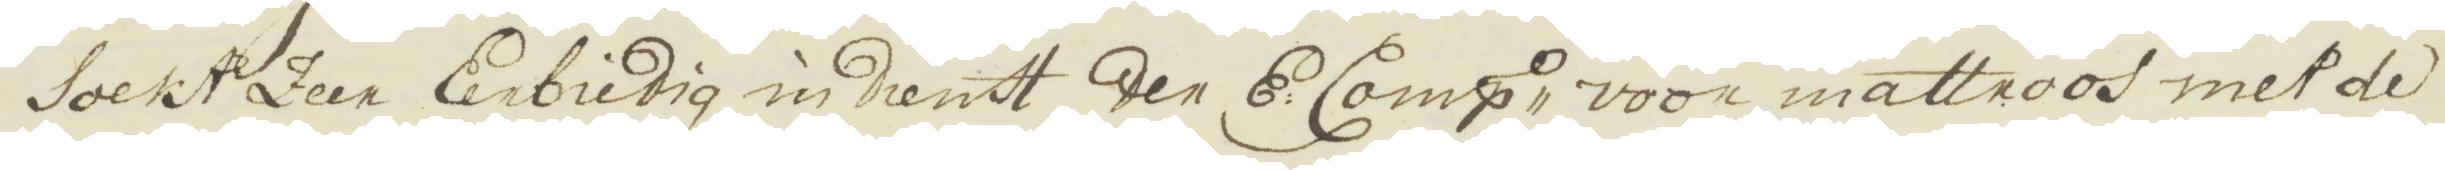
soekt zeer Eerbiedig in dienst der E: Comp„e voor mattroos met de
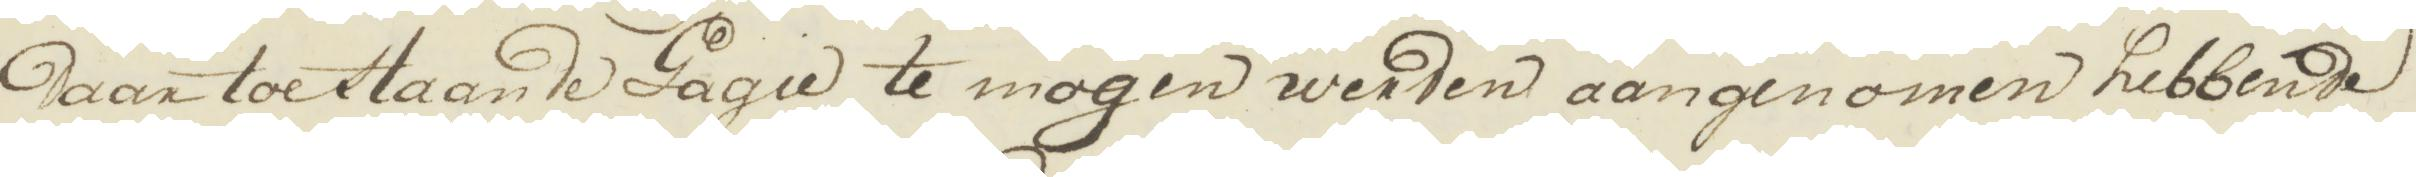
daar toe staande Gagie te mogen werden aangenomen hebbende
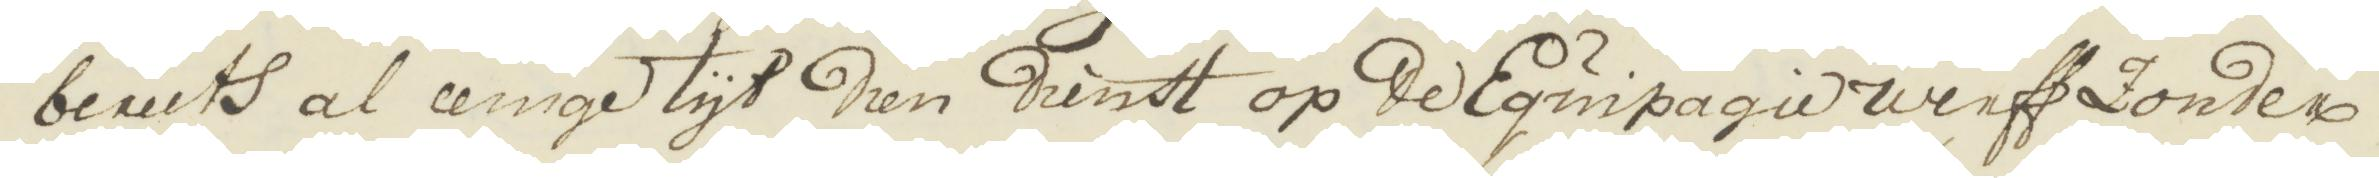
bereets al eenige tijd dien dienst op de Equipagie werff zonder
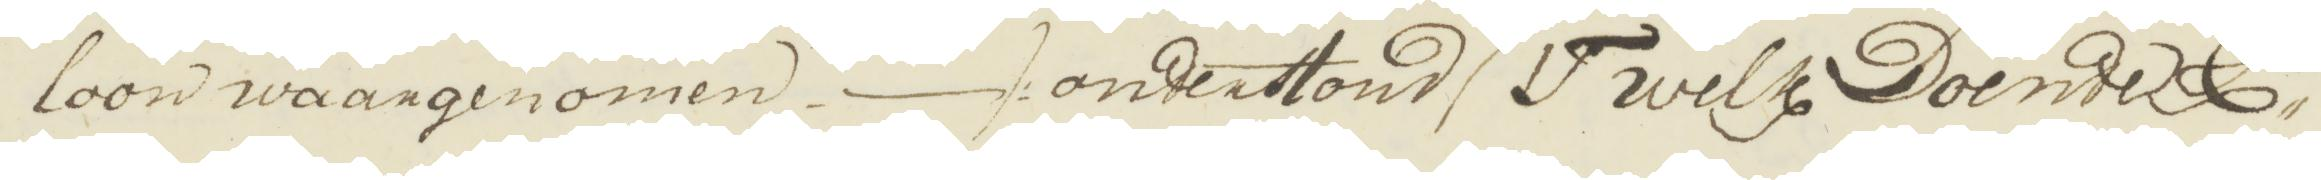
loon waargenomen- — /: onderstond / 'T welk Doende &„a
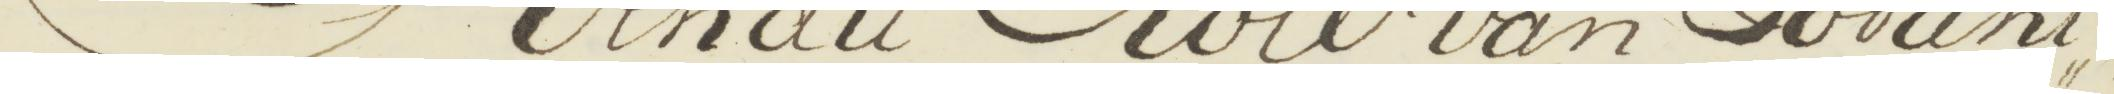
Vendu Roll van Sodani„
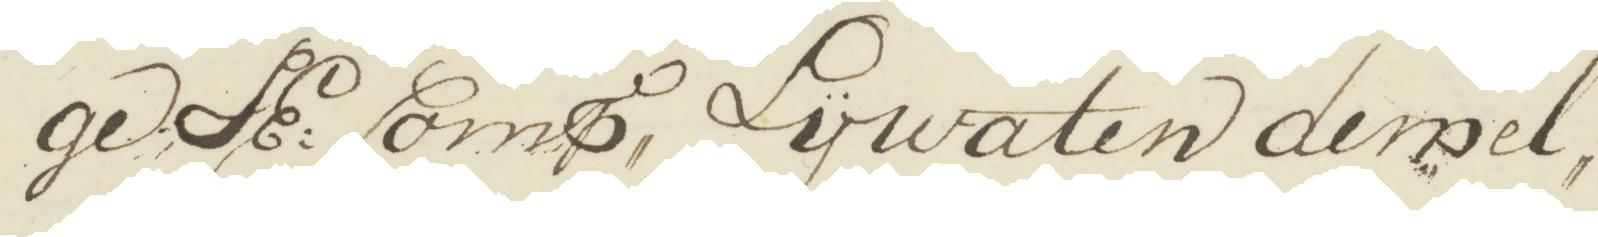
ge sE: Comp„e Lijwaten dewel„
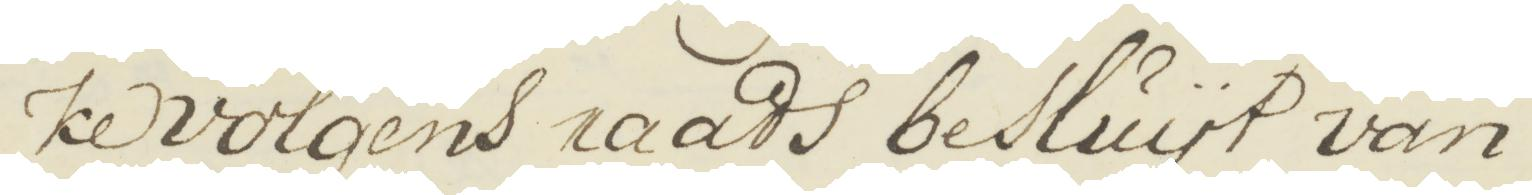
ke volgens raads besluijt van
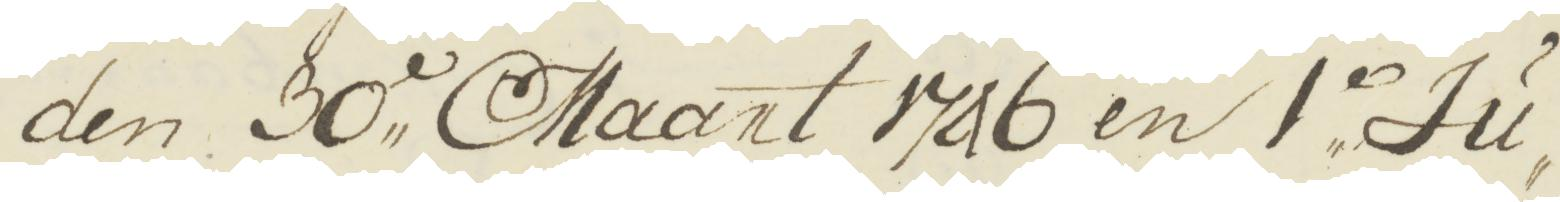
den 30„e Maart 1746 en 1„e Iu„
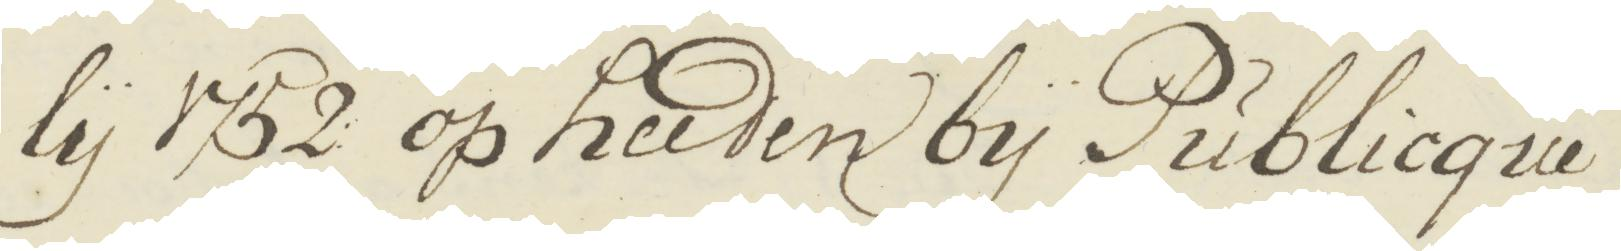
lij 1752: op heeden bij Publicque
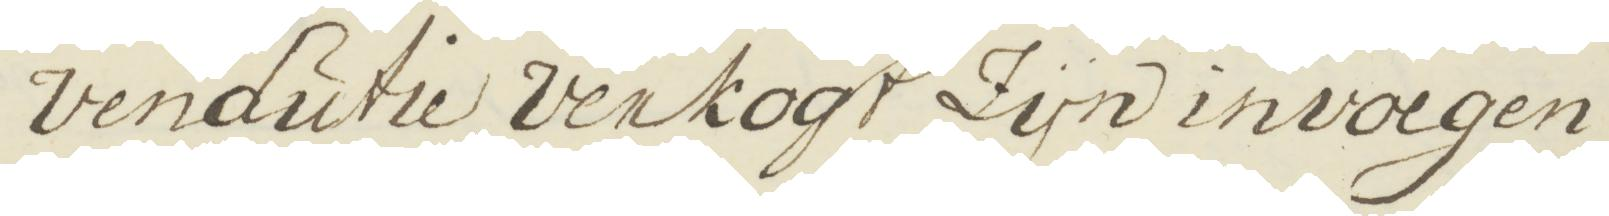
vendutie verkogt zijn invoegen
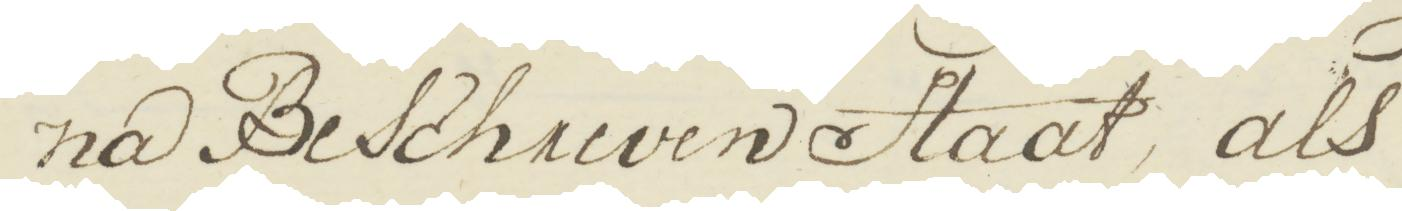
na Beschreven staat, als
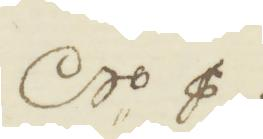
N„o per
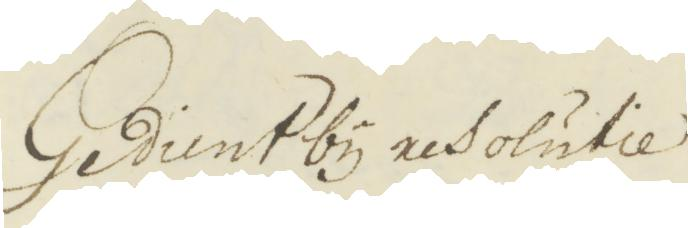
Gedient bij resolutie
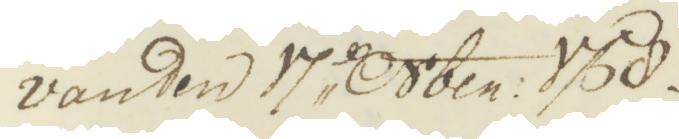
van den 17„e Nber: 1758
